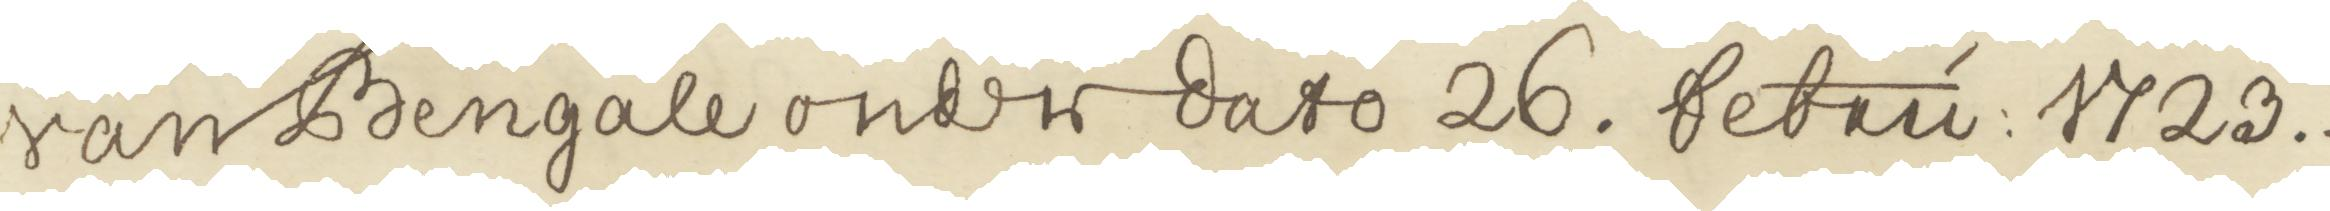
van Bengale onder dato 26. febru: 1723.
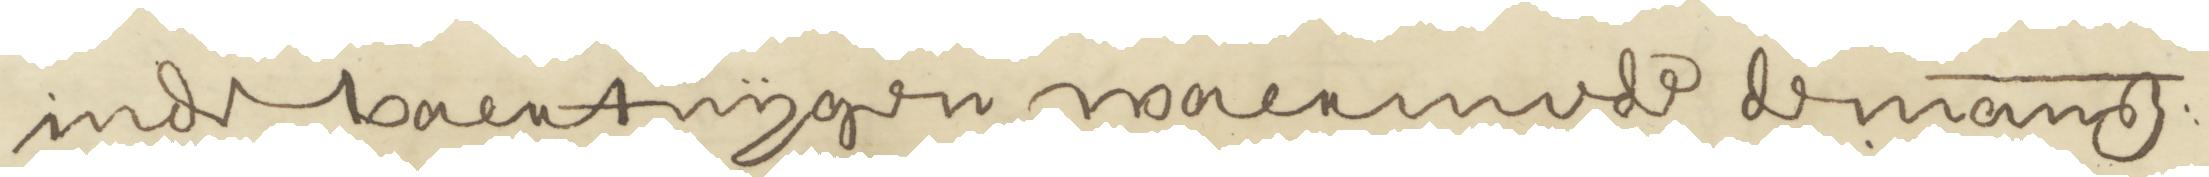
inde vaertuijgen waermede de mans.
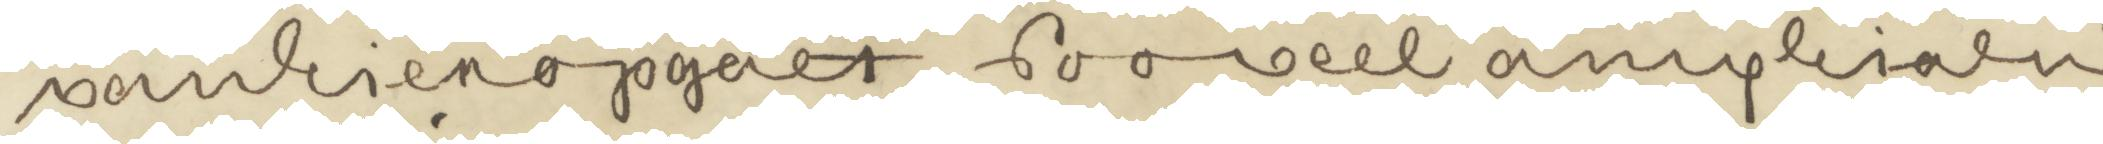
van hierop gaet soo veel amphiaen
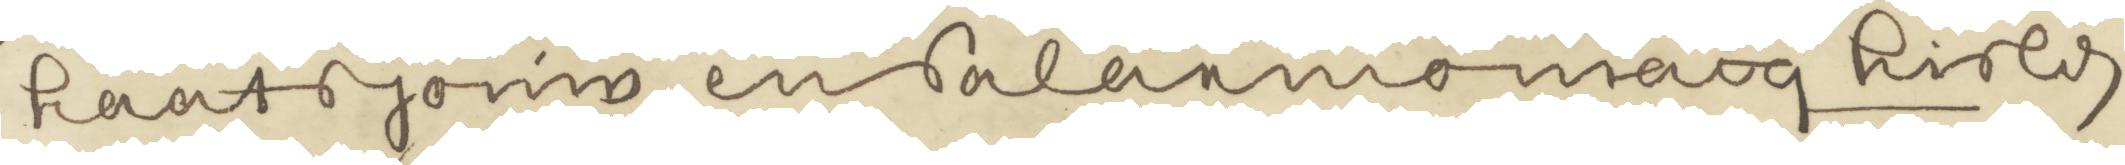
kaatsjouw en salarmoniacq kisten
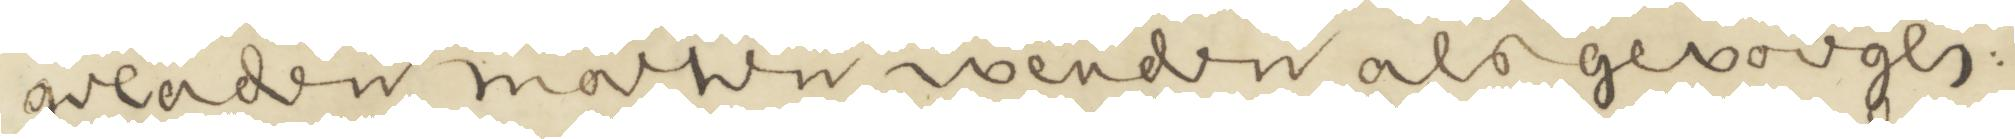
geladen moeten werden als gevoeglijk
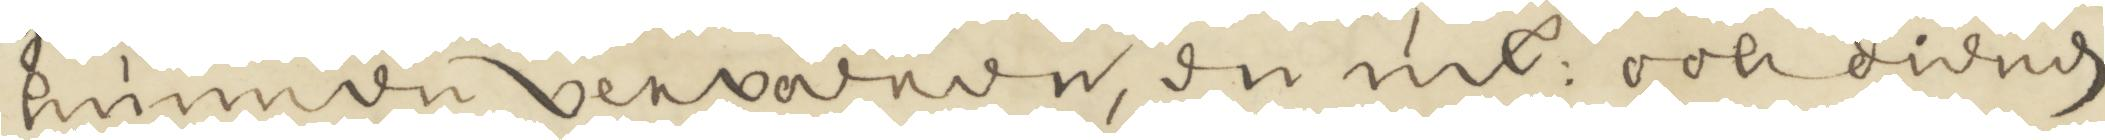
kunnen vervoeren, en uE: ook dienen
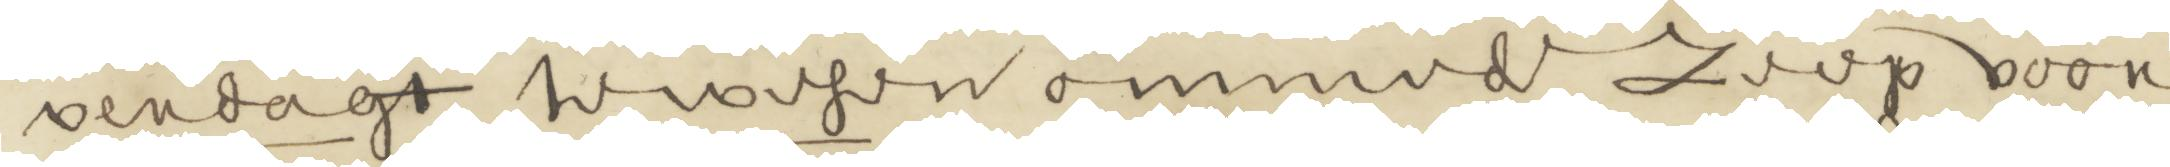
verdagt te wesen omme de zeep voor
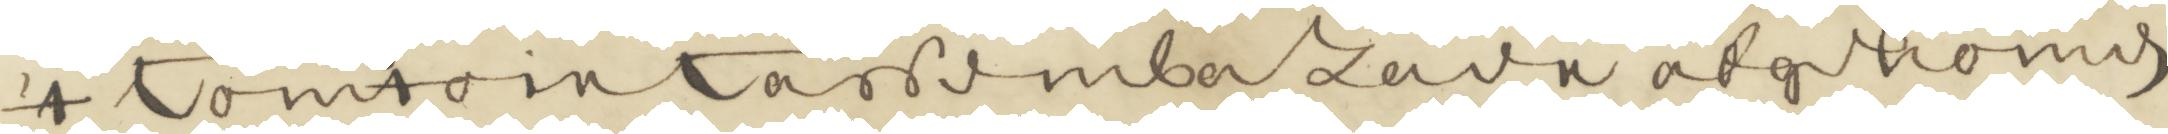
’t Comtoir Cassembazaer afgekomen
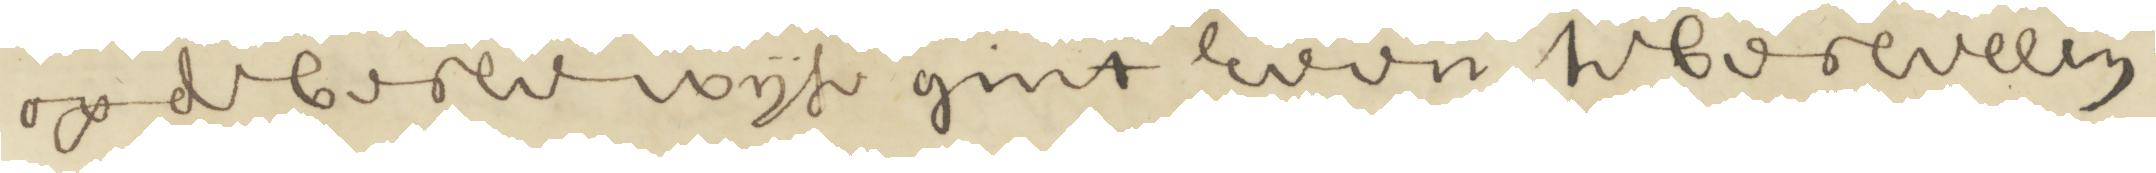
op de beste wijse gint heen te bestellen
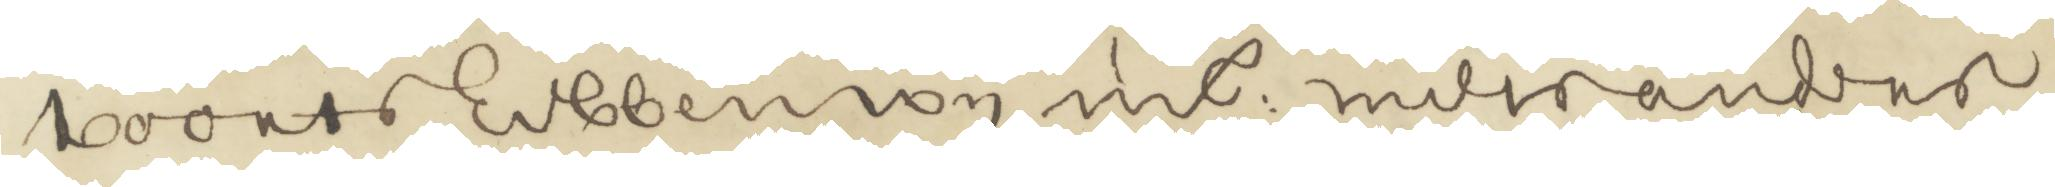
voorts hebben wij uE: niets anders
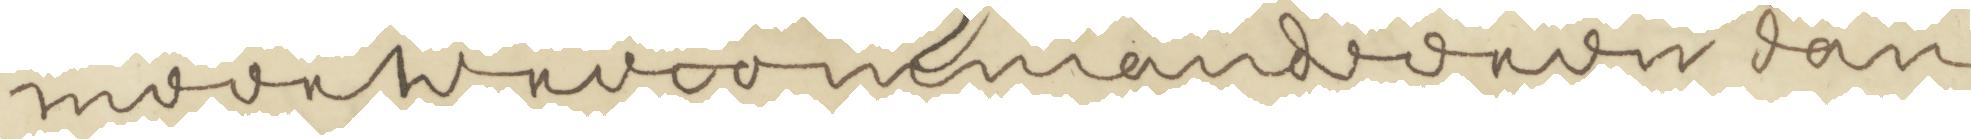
meer te recommandeeren dan
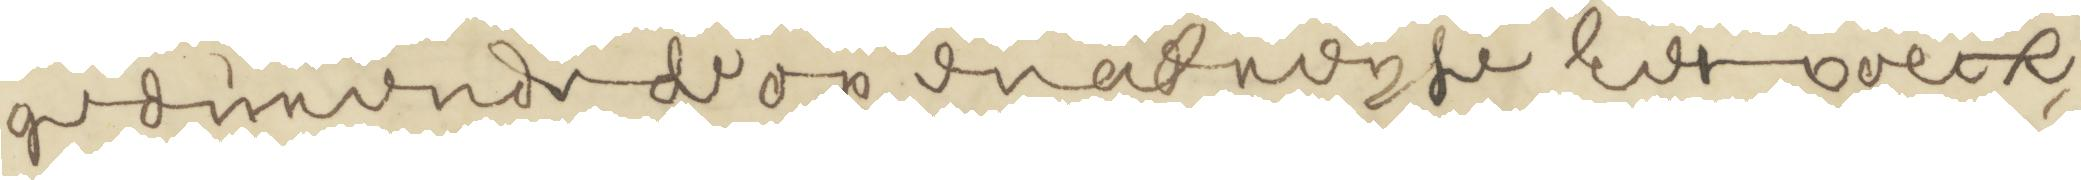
gedurende de op en afreijse het volck,
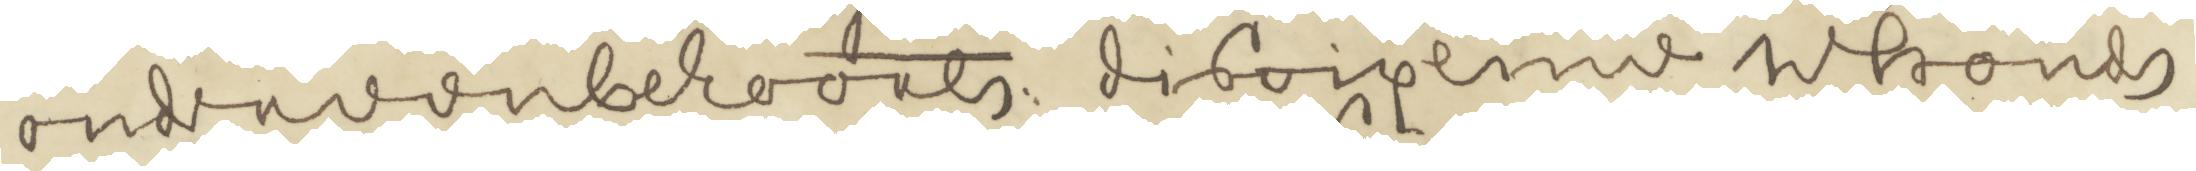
onder een behoorlijk disoipline te houden
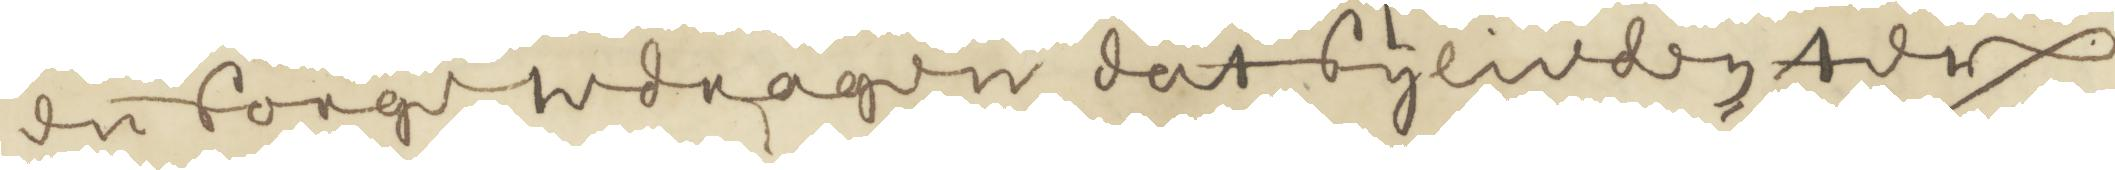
en sorge te dragen dat sijlieden ter —
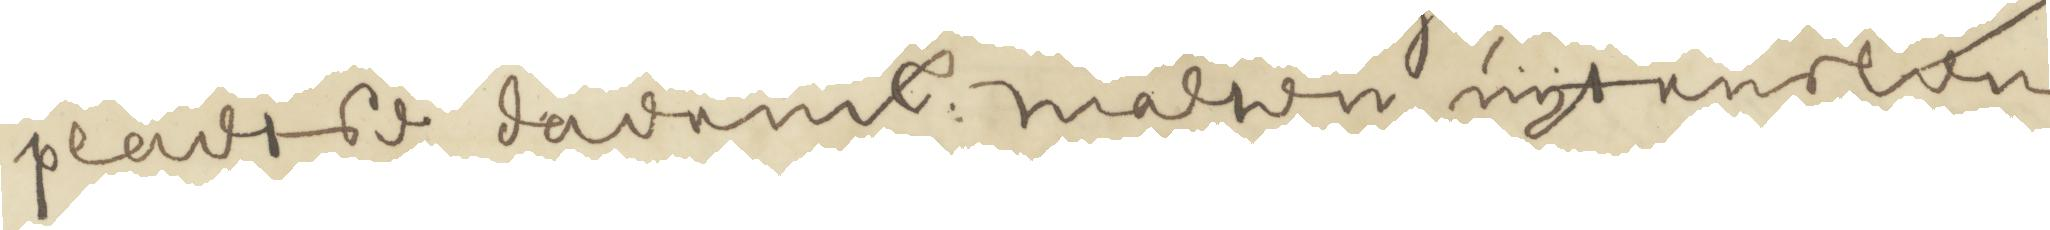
plaetse daer uE: moeten uijtrusten
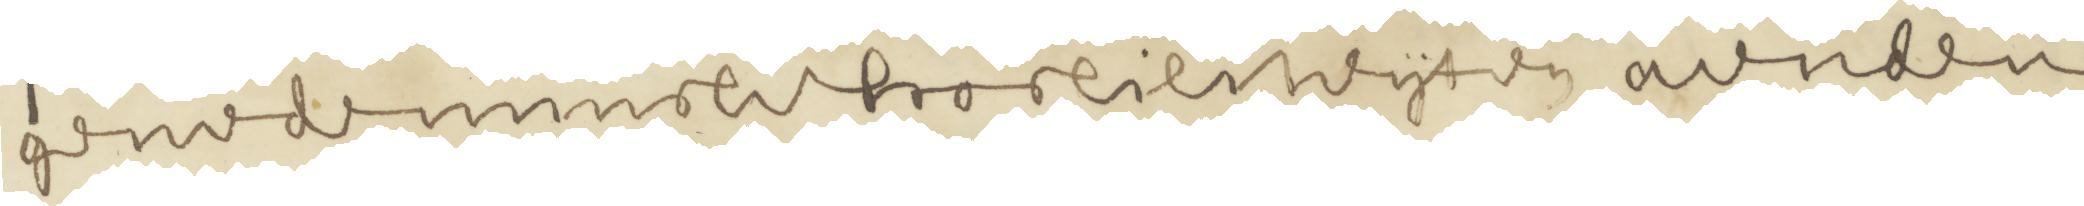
gene de minste hostiliteijten aenden
